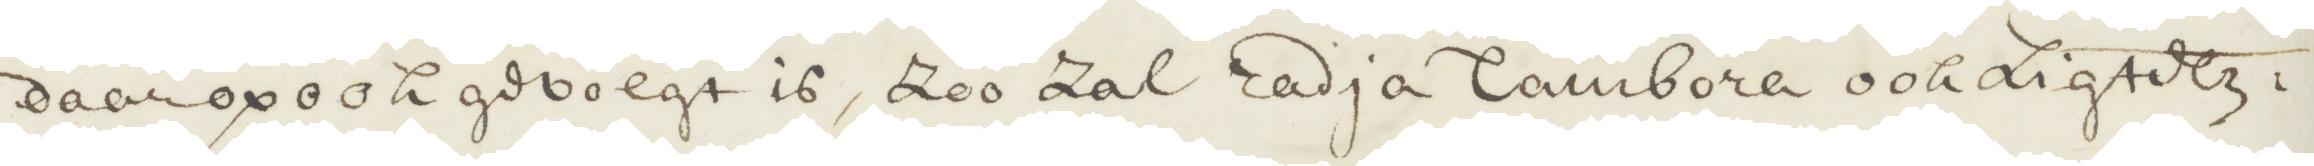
daar op ook gevolgt is, zoo zal radja Tambora ook ligtelijk
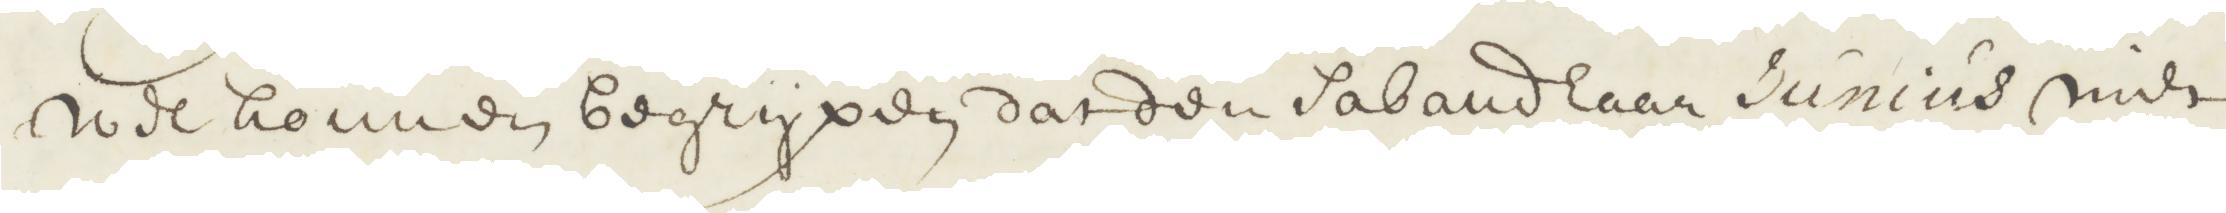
wel konnen begrijpen dat den sabandhaar Iunius niet
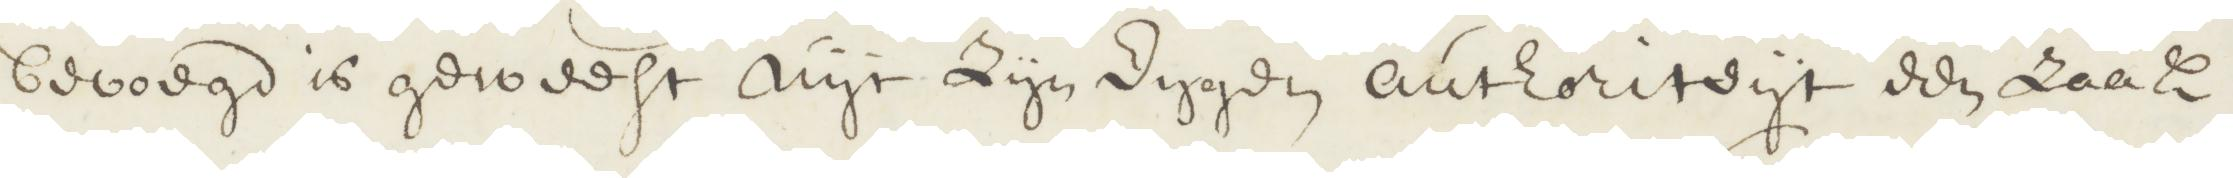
bevoegd is geweest uijt zijn Eijgen authoriteijt een zaak
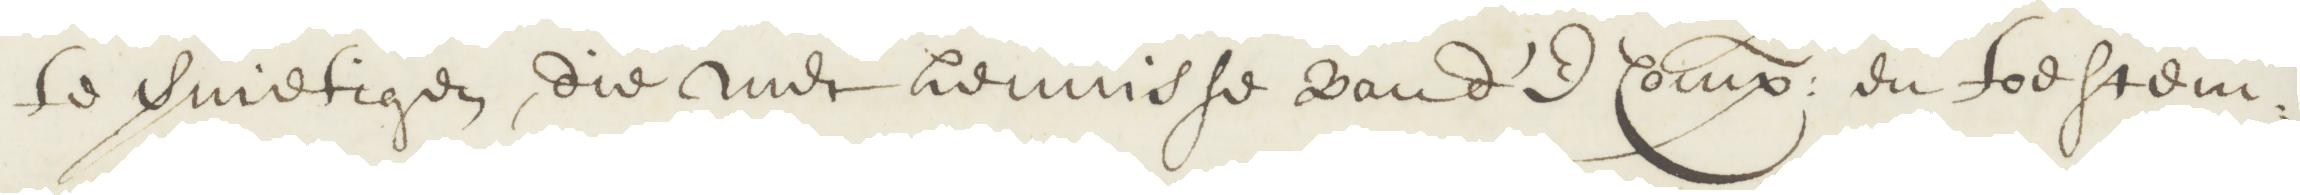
te vernietigen, die met kennisse van d’ E Comp: en toestem:
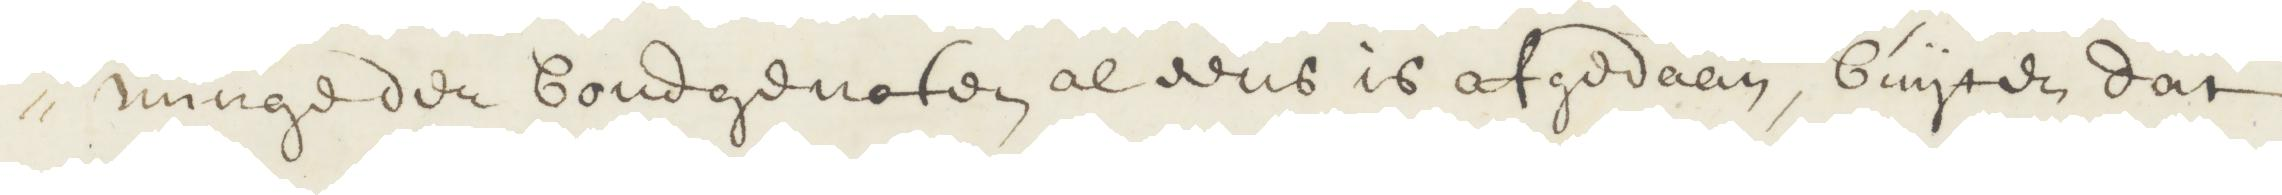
„ minge der bondgenoten al eens is afgedaan, buijten dat
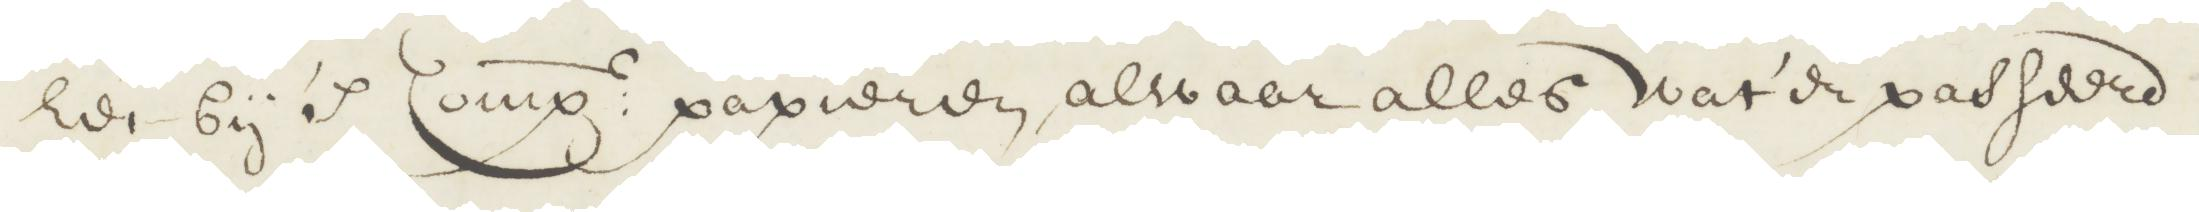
het bij ’s Comp:s papieren, alwaar alles wat 'er passeerd
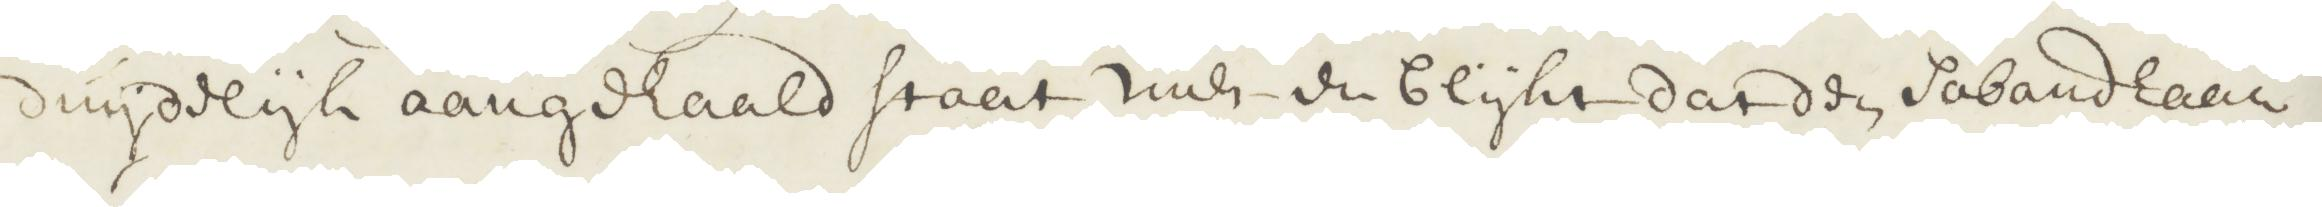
duijdelijk aangehaald staat, niet en blijkt dat den Sabandhaar
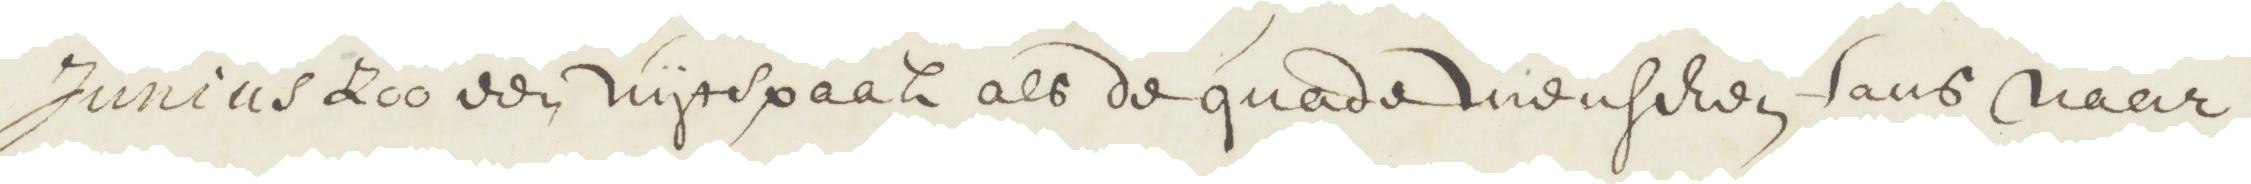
Junius zoo een uijtspaak als de quade menschen tans naar
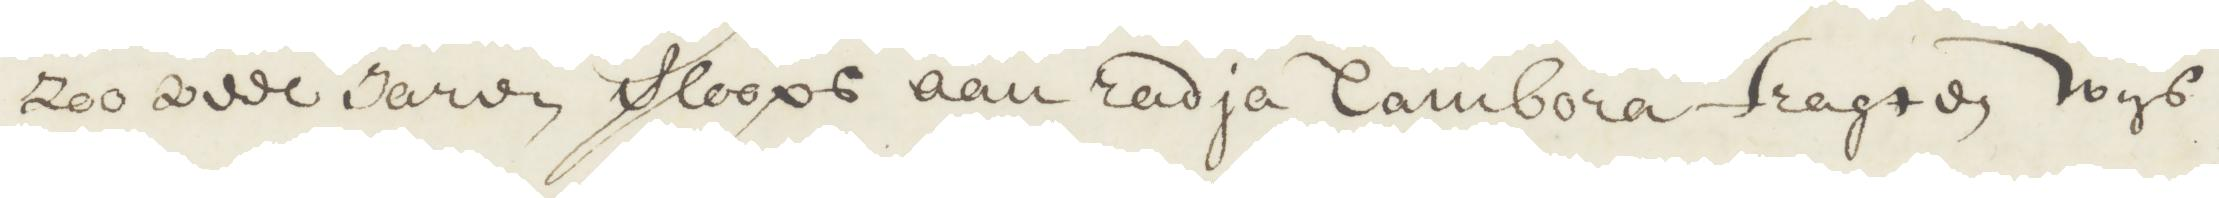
zoo veel Jaren verloops aan radja Tambora tragten wijs
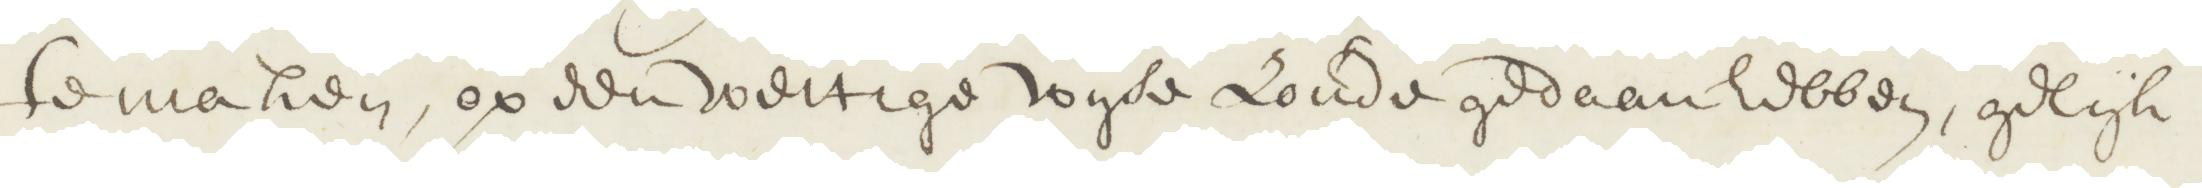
te maken, op een wettige wijse zoude gedaan hebben, gelijk
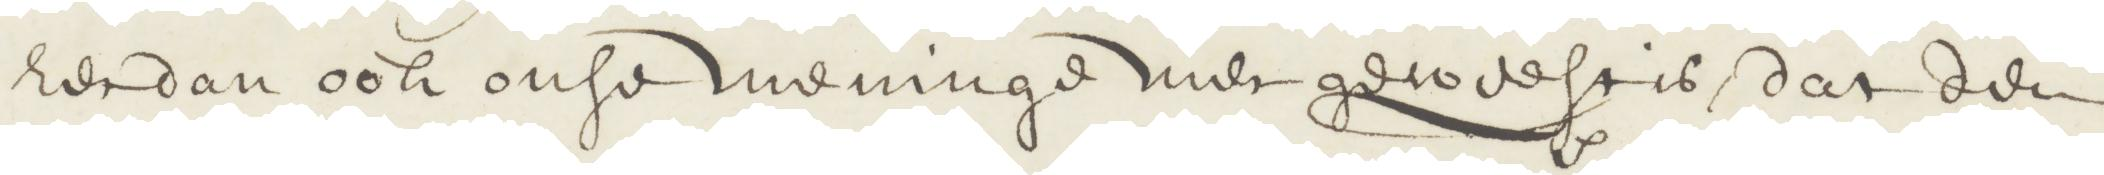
het dan ook onse meninge niet geweest is, dat den
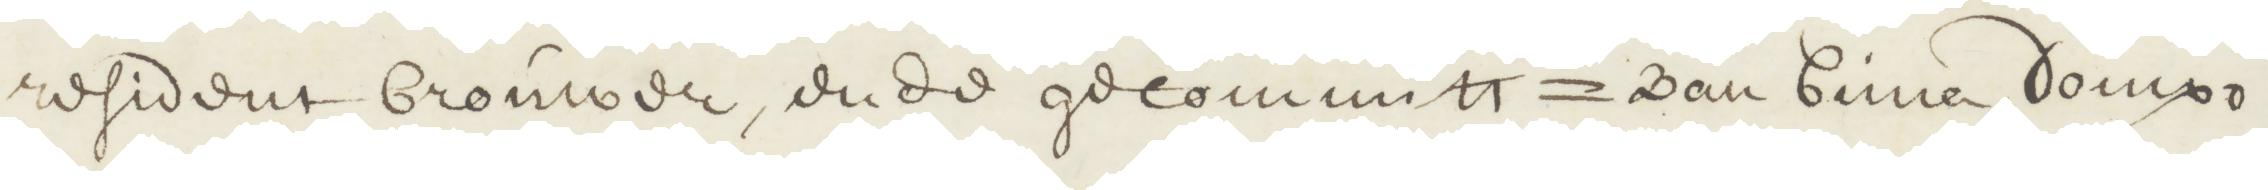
resident brouwer, ende gecommitt=s van bima, dompo
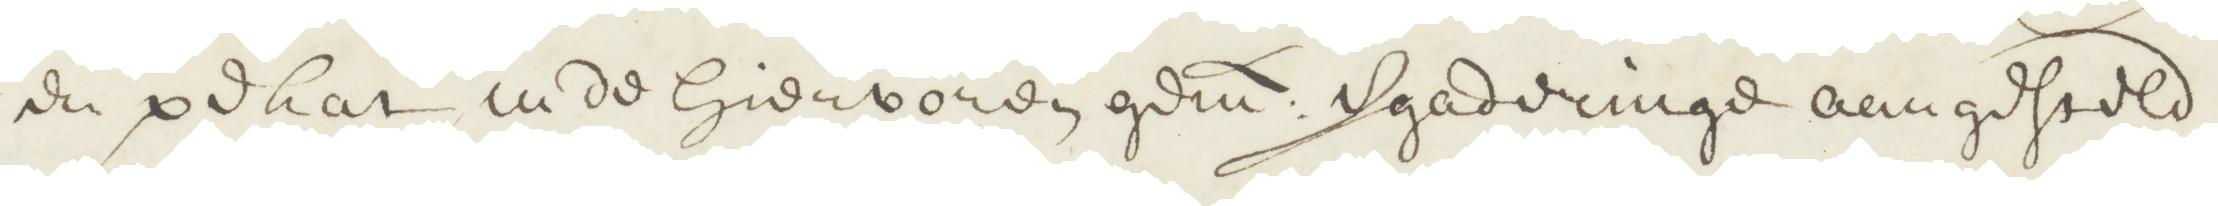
en pekat, in de hiervoren gem: vergaderinge aangesteld
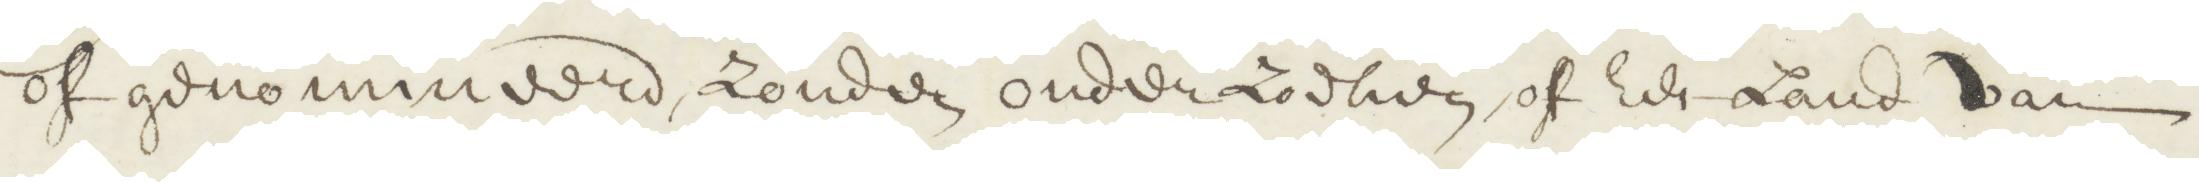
of genomineerd, zouden onderzoeken, of het Land van
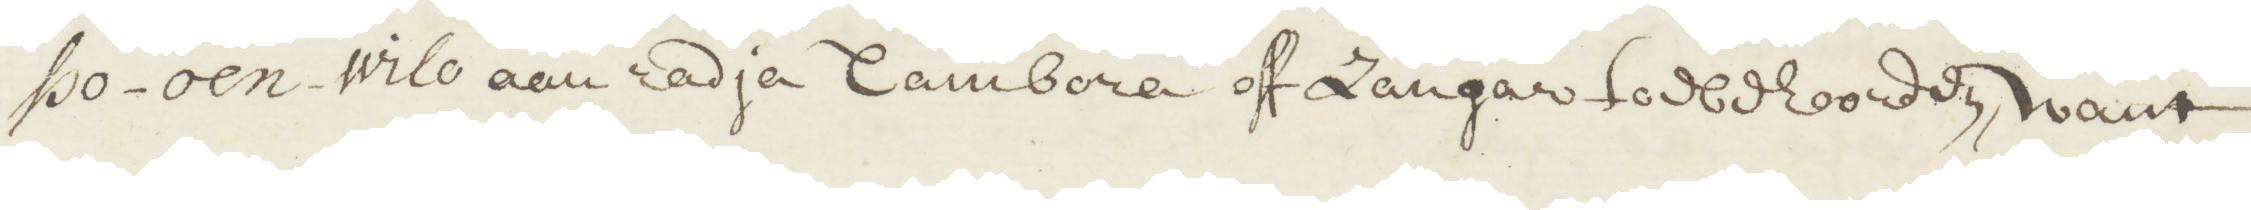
po-oen-Wilo aan radja Tambora off Zangaer toebehoorden, want
